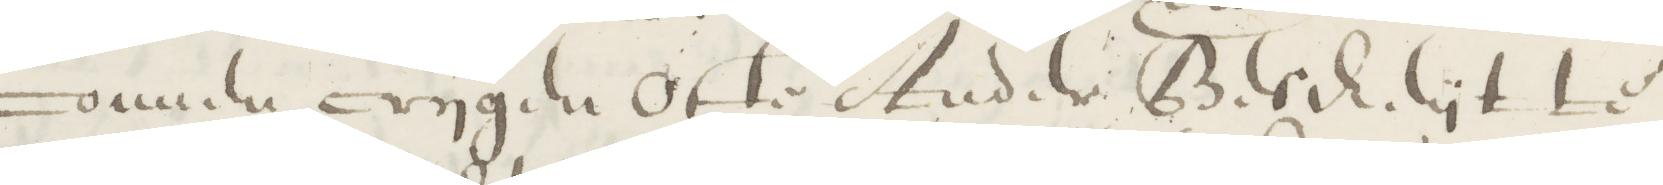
connen crijgen ofte Ander Bescheijt te
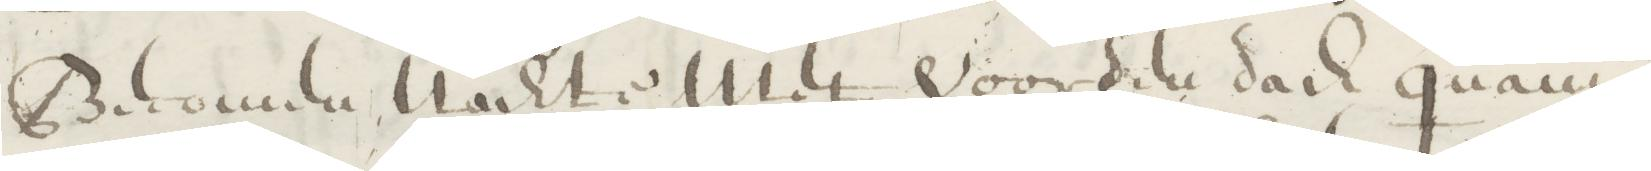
Becomen, nachte met voorden dach quam
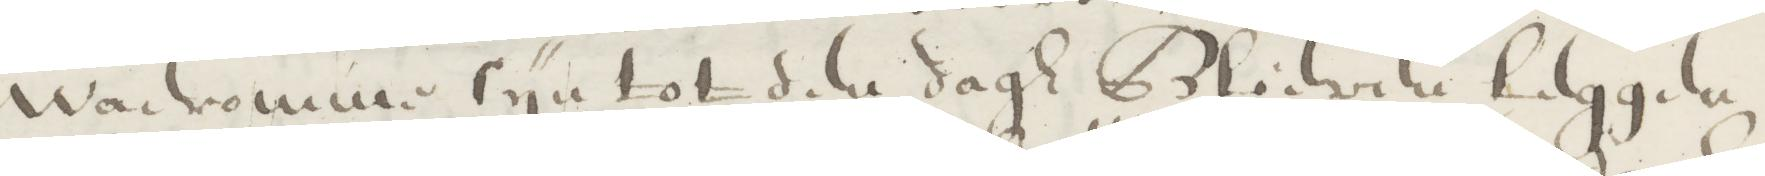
waeromme sijn tot den dagh Blieven leggen
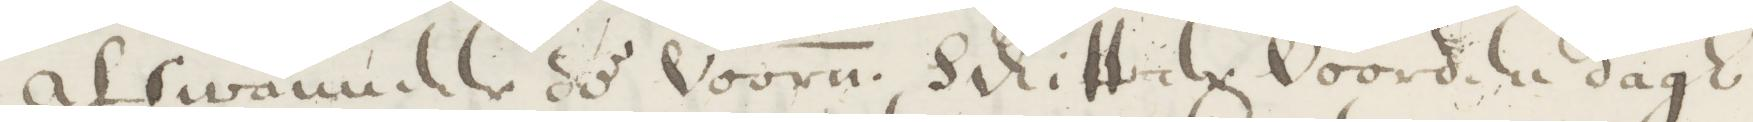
als wanneer de voorn. schipper voorden dagh
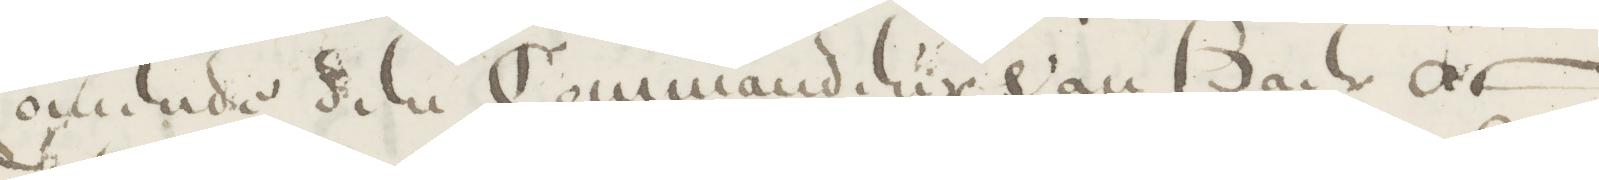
Comende den Commandeur van haer aff
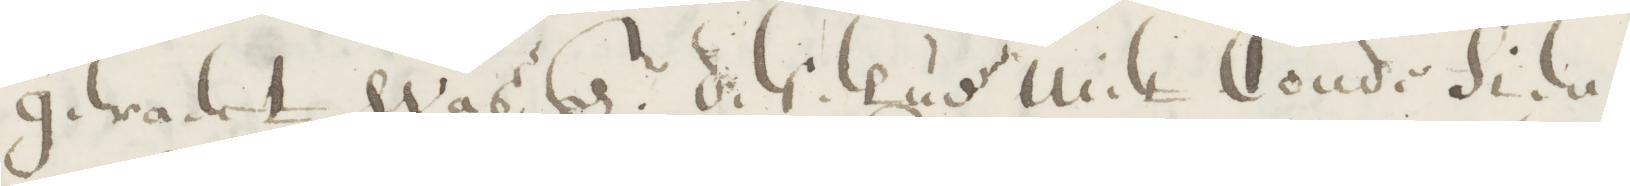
gevaert was ende deselve niet Conde sien
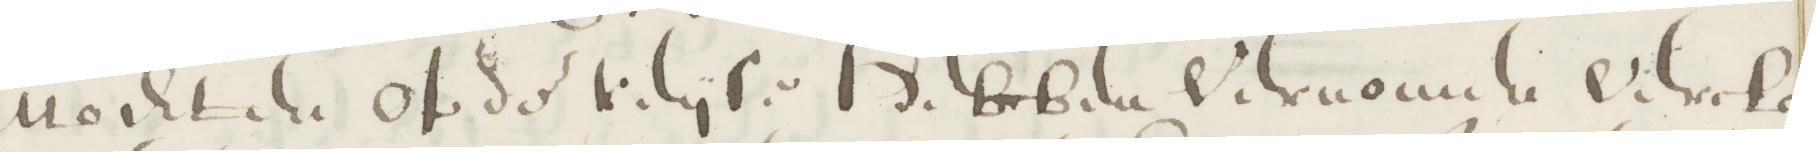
nochten op de reijse Hebben vernomen vercla
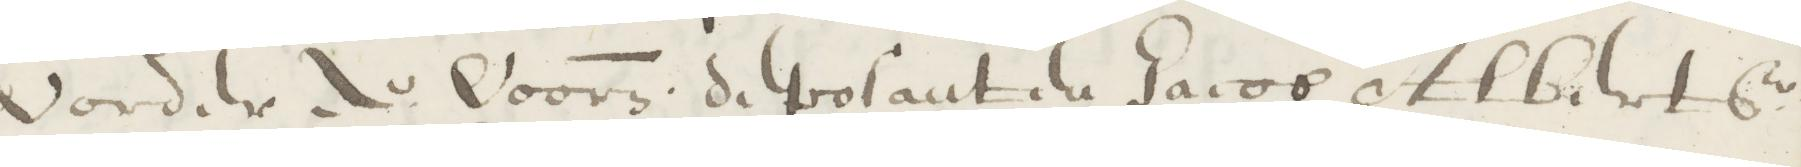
vorder E. voorn. deposanten Iacob Alberts.n
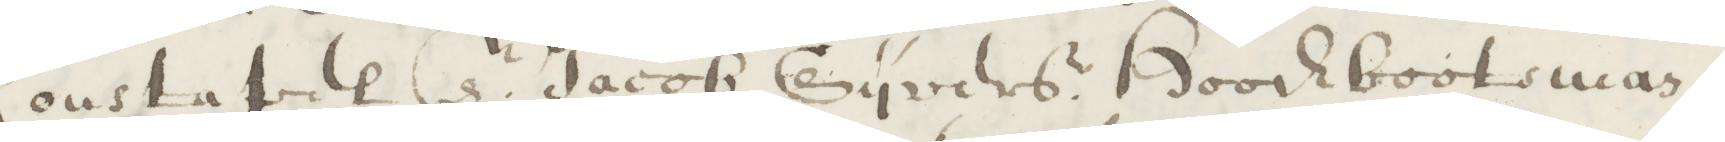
Constapel ende Iacob Gijvers.n Hoochbootsman
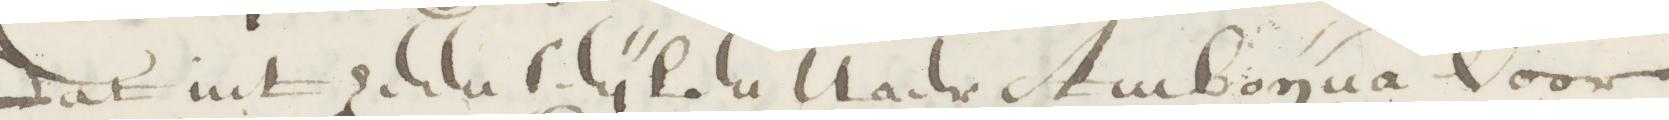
dat int heen seijlen naer Amboijna voor
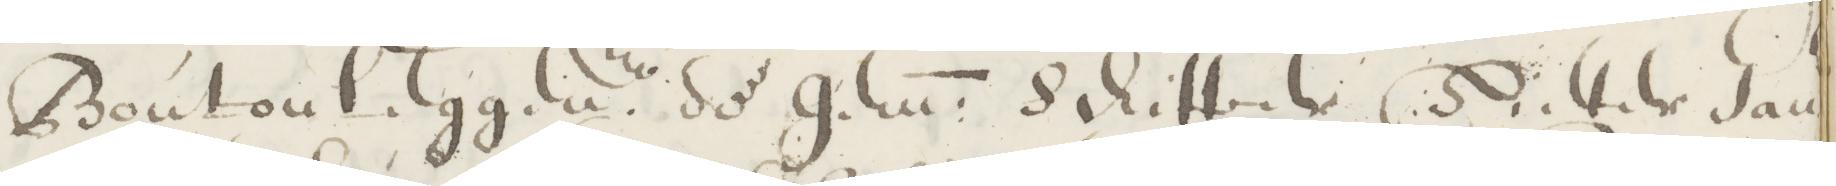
Bouton leggen.n de gem: schipper Pieter Ian
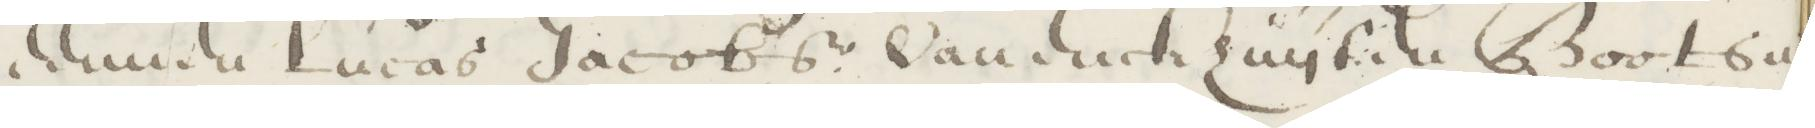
eennen Lucas Jacobs.n van enckhuijsen Bootsm
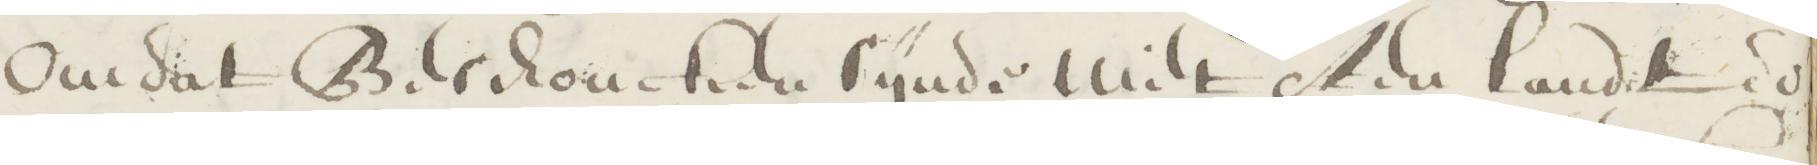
omdat Beschoncken sijnde niet Aen landt te
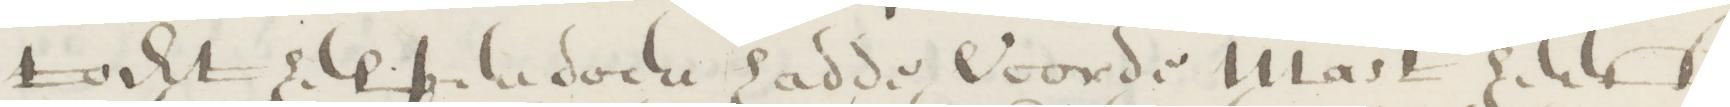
tocht helpen doen hadde voor de mast heeft
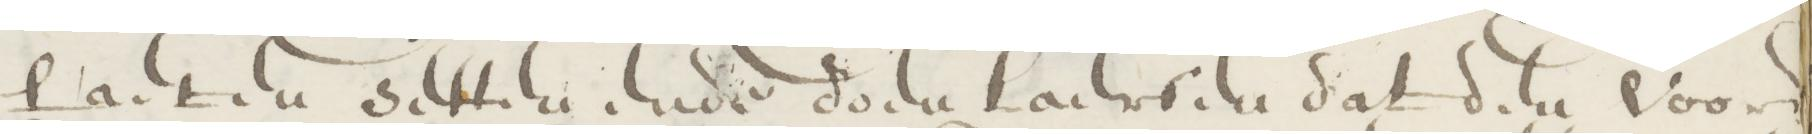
laeten setten eende doen laersen dat den voor
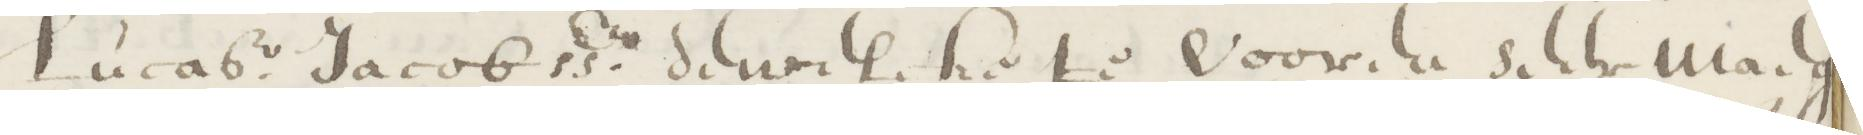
Lucas.n Jacobss.n dewelcke te vooren seer maeg
